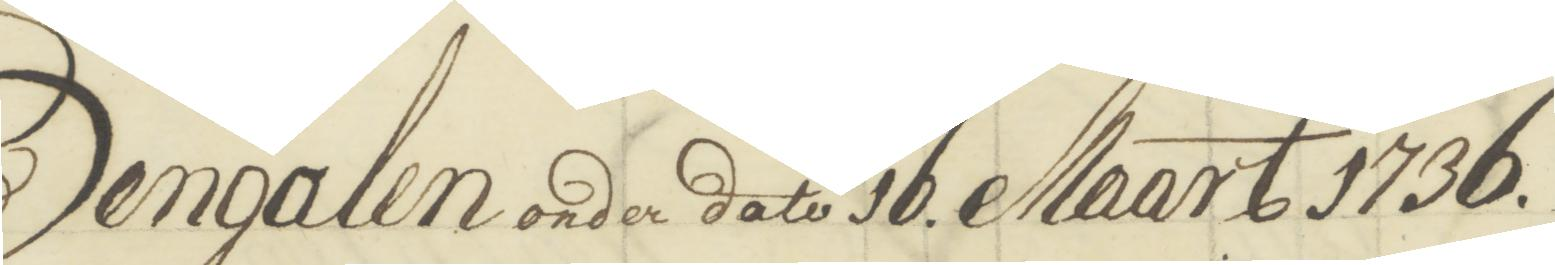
Van Bengalen onder dato 16.' Maart 1736.
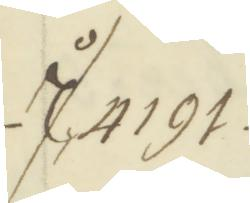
R:o/, 4191.
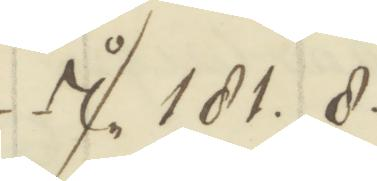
R:o/, 181. 8.
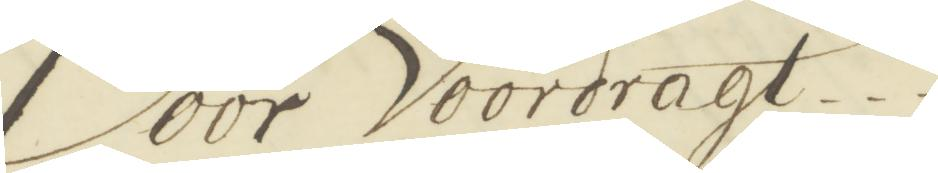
Voor Voordragt . - -
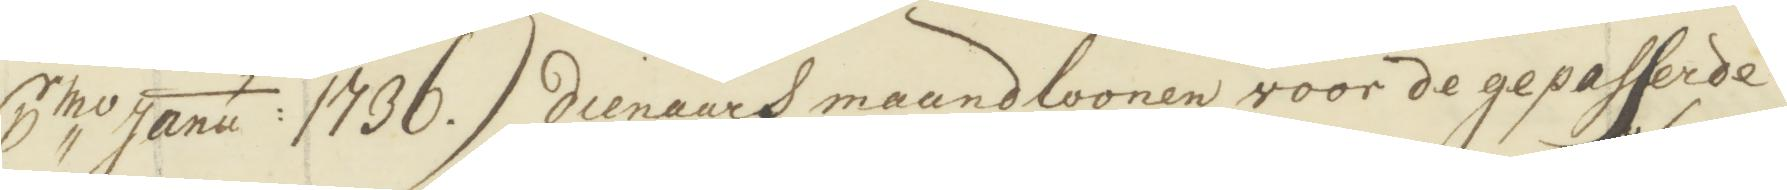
3p:r mo Janu: 1736. dienaars maandloonen voor de gepasserde
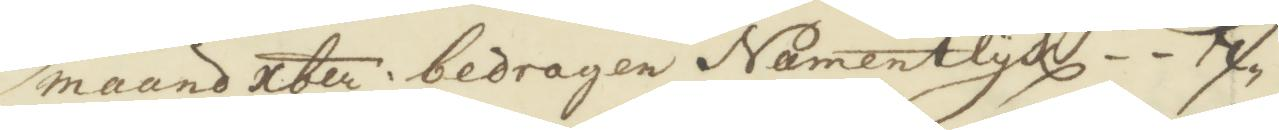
maand xber: bedragen Namentlijk - - r:o/,
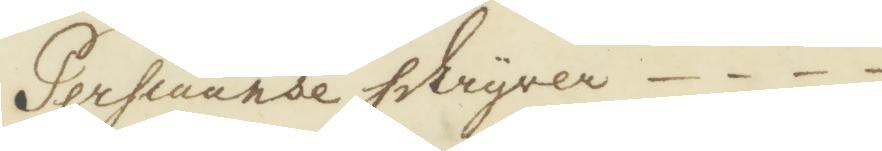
Persaanse schrijver - - - -
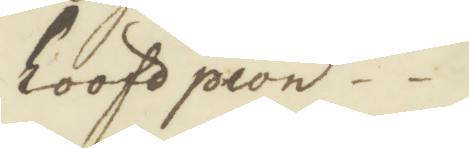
hoofd pion - -
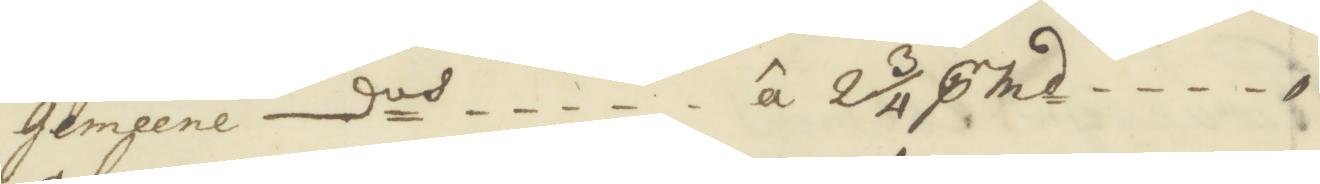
gemeene D:os - - - - - â 2¾ p:r md - - - - „
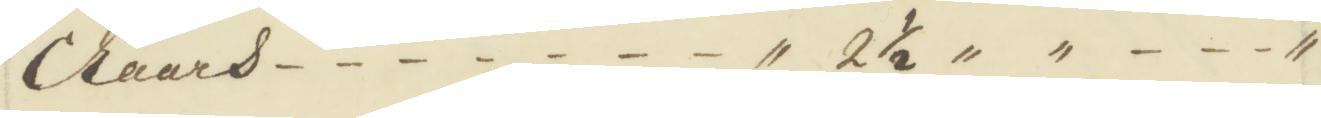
Chaars - - - - - - - „ 2½ „ „ - - - „
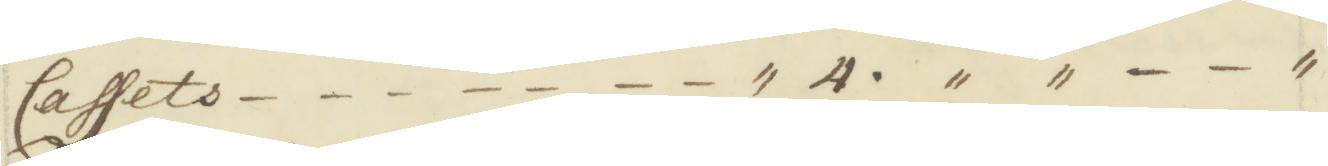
Cassets - - - - - „ 4. „ „ — — „
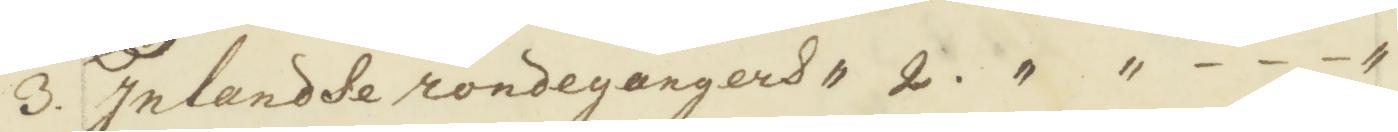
3. Jnlandse rondegangers „ 2. „ „ - - - „
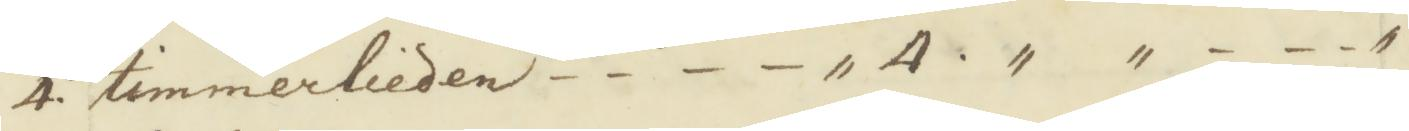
4. timmerlieden - - - - „ 4. „ „ - - - „
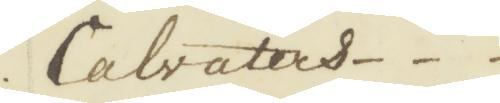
Calvaters - - -
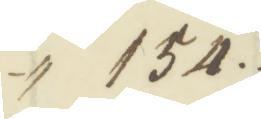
„ 154.
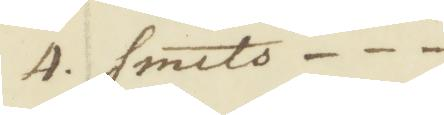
4. Smits - - -
